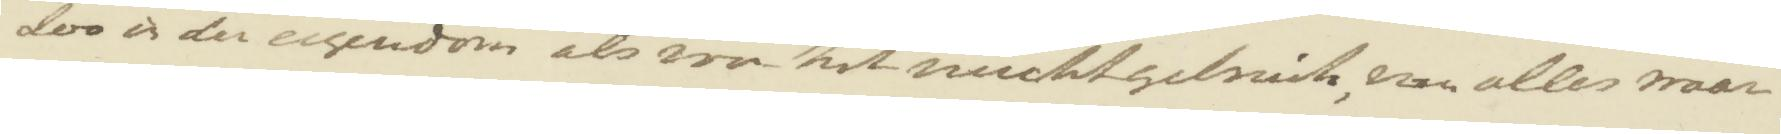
zoo in der eigendom als van het vruchtgebruik, van alles waar
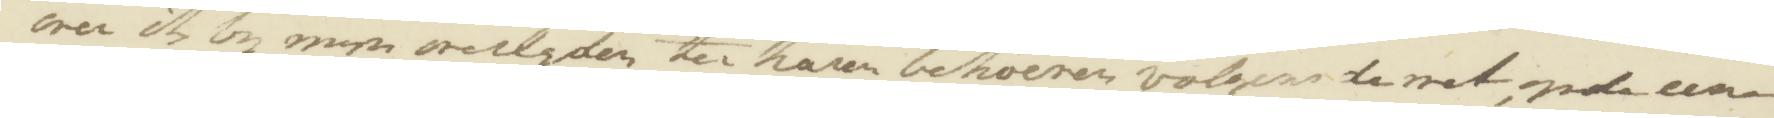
over ik by myn overlyden ter haren behoeven volgens te wet op de eene
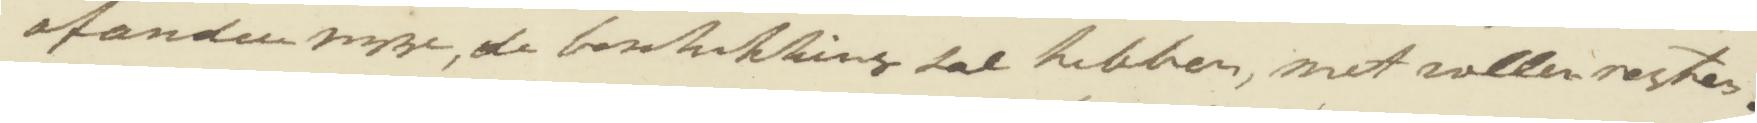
of andere wyze, de beschikking zal hebben, met vollen regten,
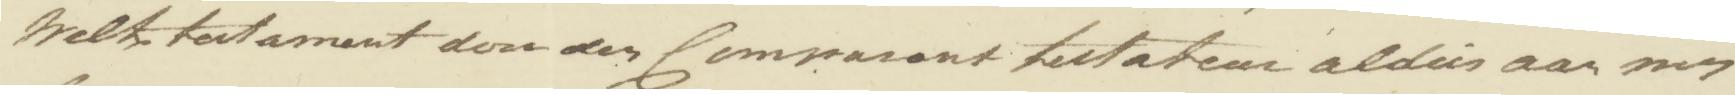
welk testament door den Comparant testateur aldus aan my
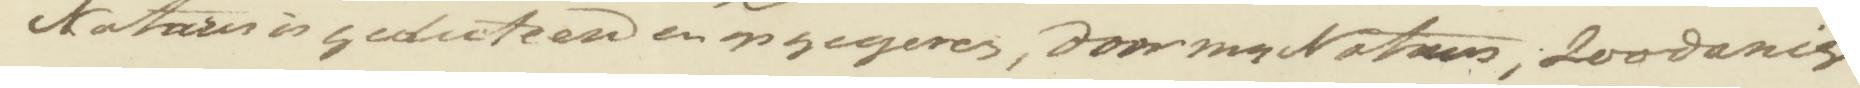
Notaris is gedicteerd en opgegeven, door my Notaris, zoodanig
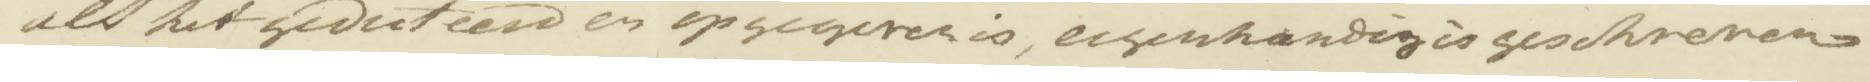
als het gedicteerd en opgegeven is, eigenhandig is geschreven
